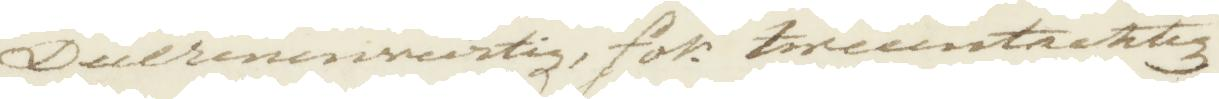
Deel zesenveertig, fol. twee en tachtig
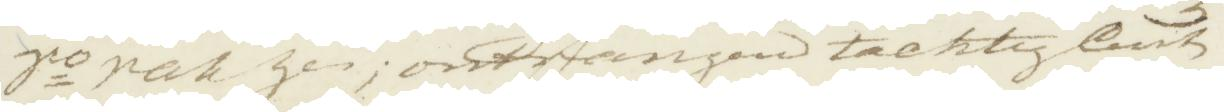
V=o vak zes; ontvangen tachtig Cent
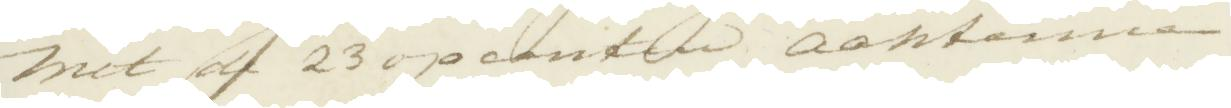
met de 23 op centen acht en ne-
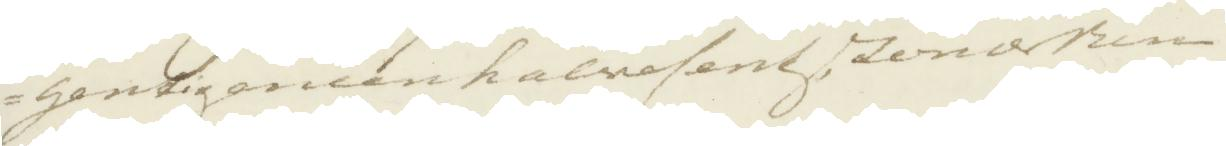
„gentig en een halve Cent, zonder ren-
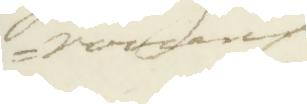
„vooien
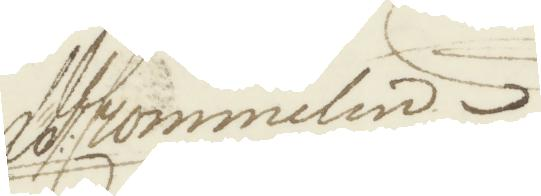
D.F: Crommelin )
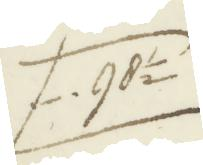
F. 98½
